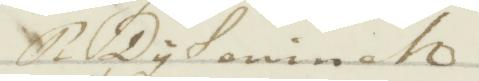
P: Dijserinck
